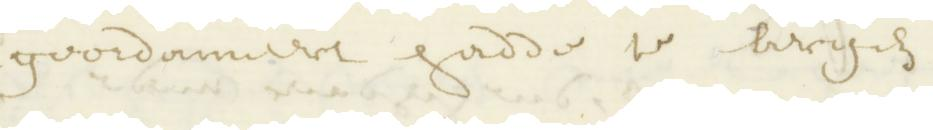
geordameert hadde te berijen
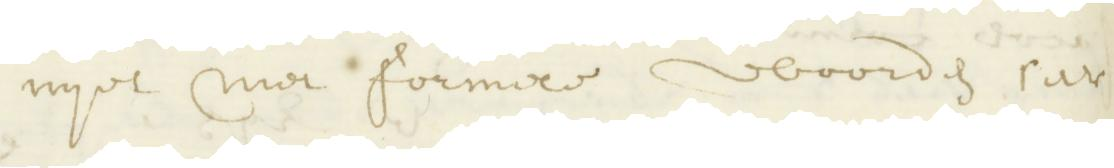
uijet met formele woorden seer
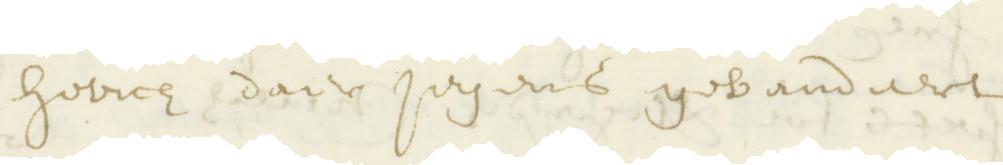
Hetick daer jeijens gebandeert
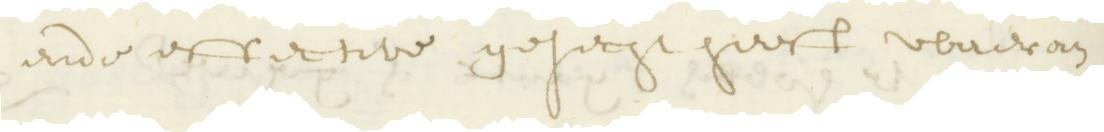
ende effective gesecht heeft waevan
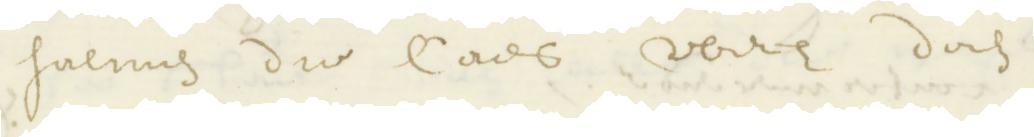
salmen die l' aes wech daen
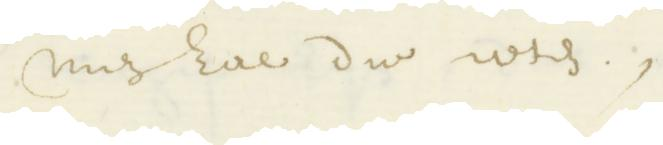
men hal die ieten.
